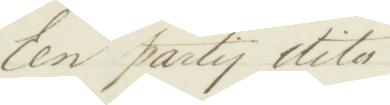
Een partij dito
